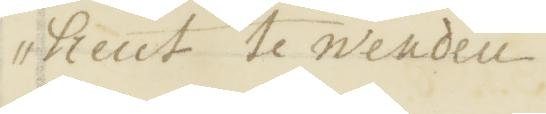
„kent te werden
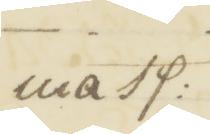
mass:
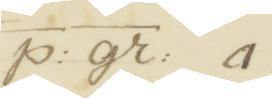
p: gr: 4
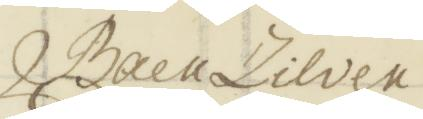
Baer Zilver
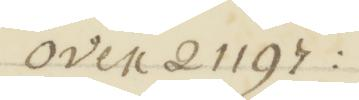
over 21197:
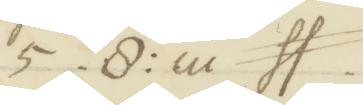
5 . 8: m ff
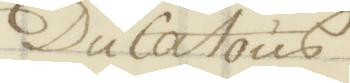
Du Catous
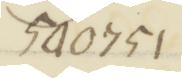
540751
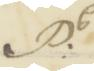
P:s
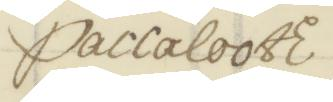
Paccalooth
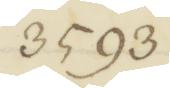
3593
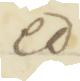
ld
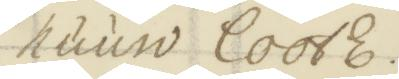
ruuw looth
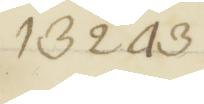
13243
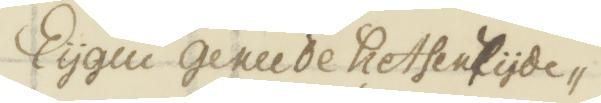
Eijgen gereede ketserrijde „
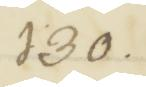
130.
